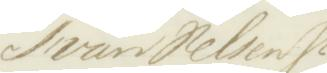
F van Velsen Jr
